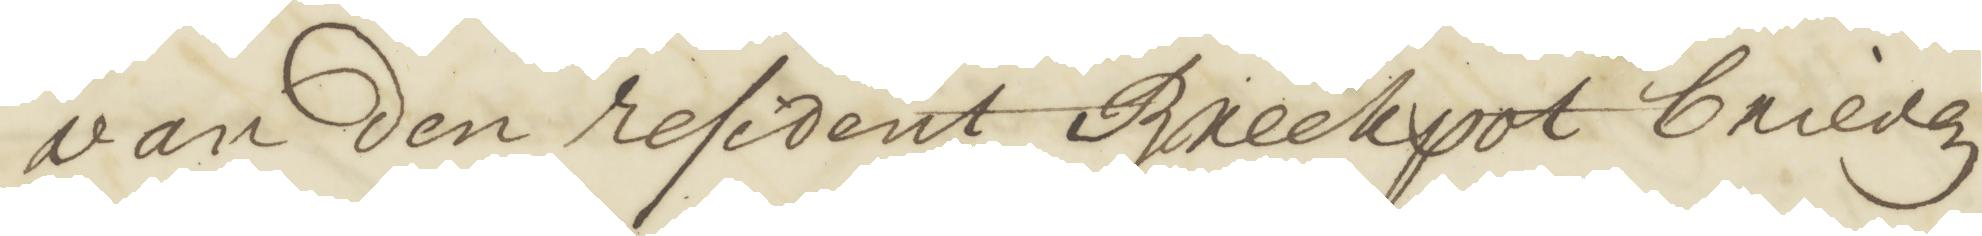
van den resident Breekpot brieven
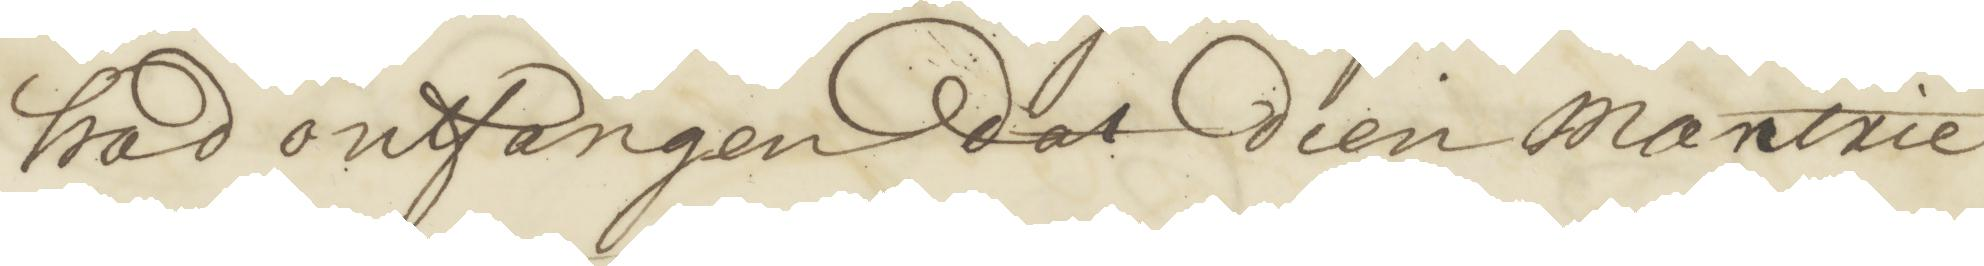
had ontfangen dat dien mantrie
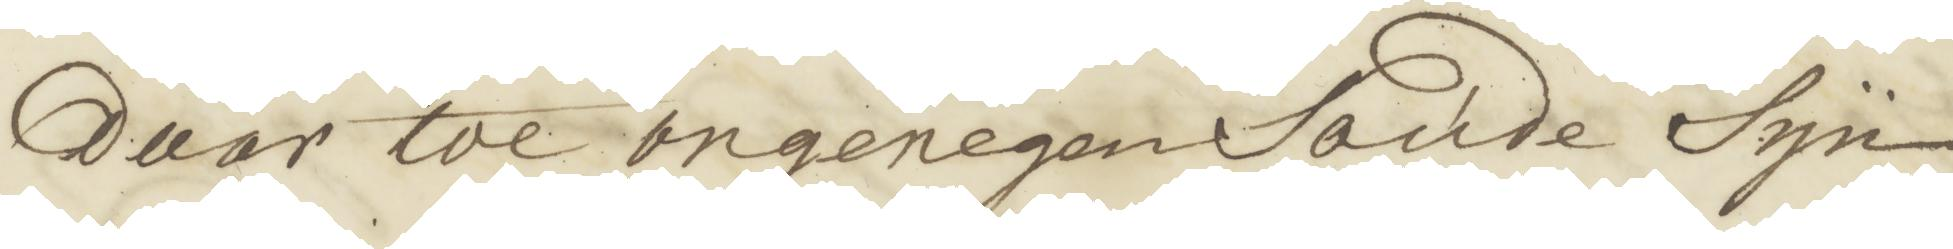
daar toe ongenegen soude sijn,
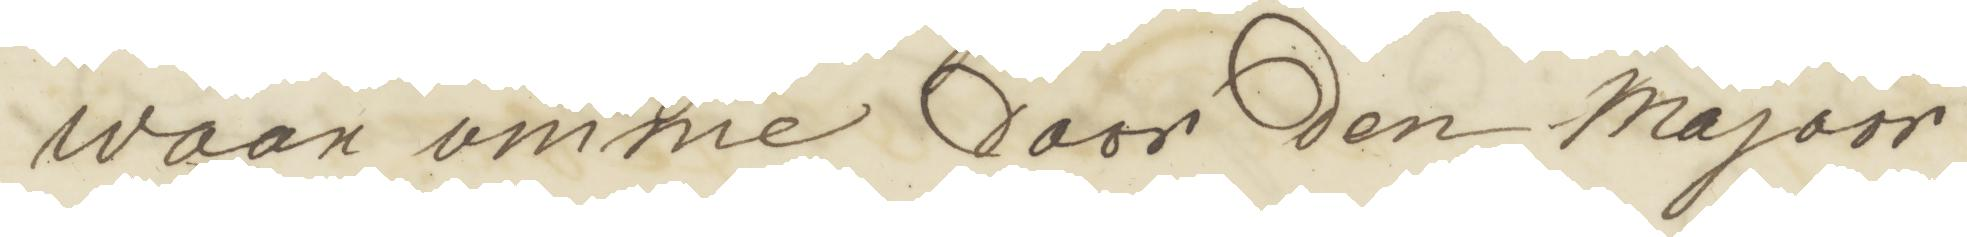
waar omme door den majoor
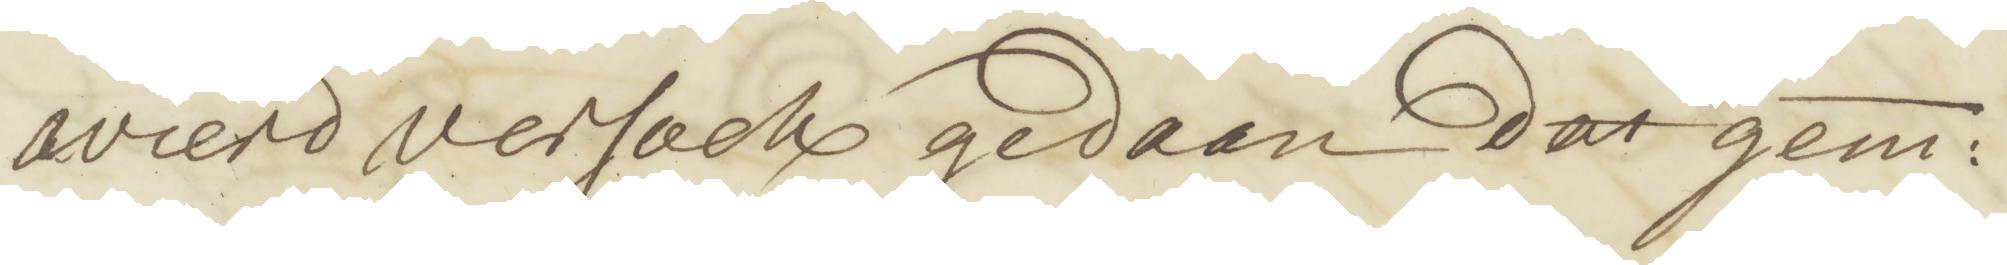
wierd versoek gedaan dat gem:
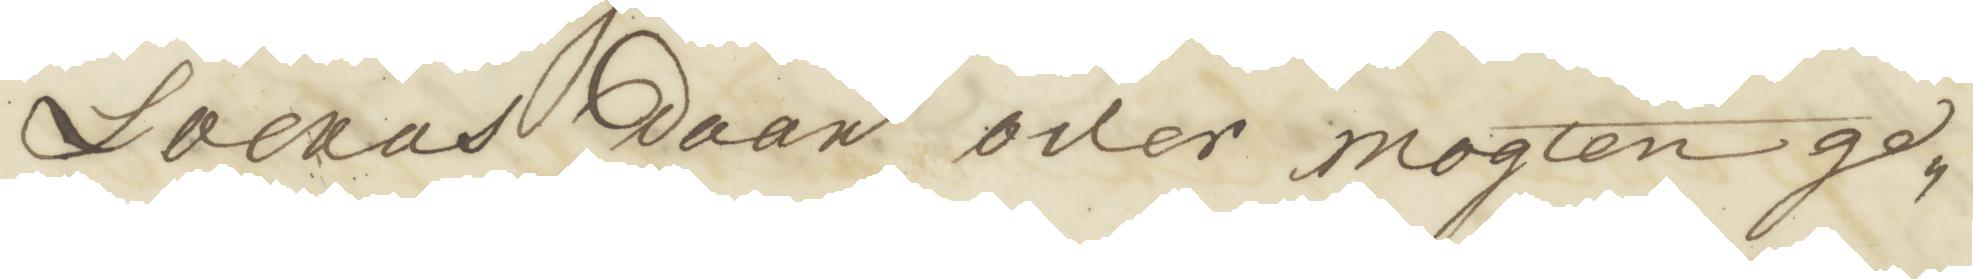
Loeras daar over mogten ge„
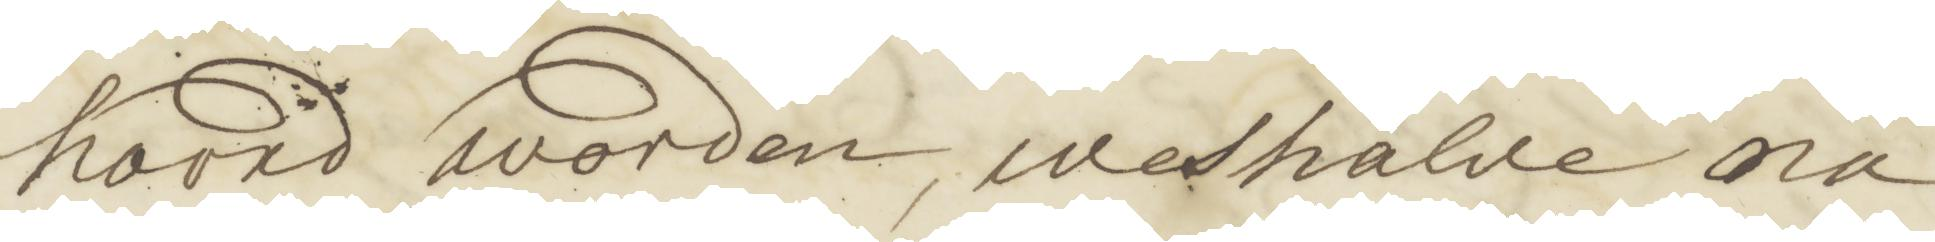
hoord worden, weshalve na
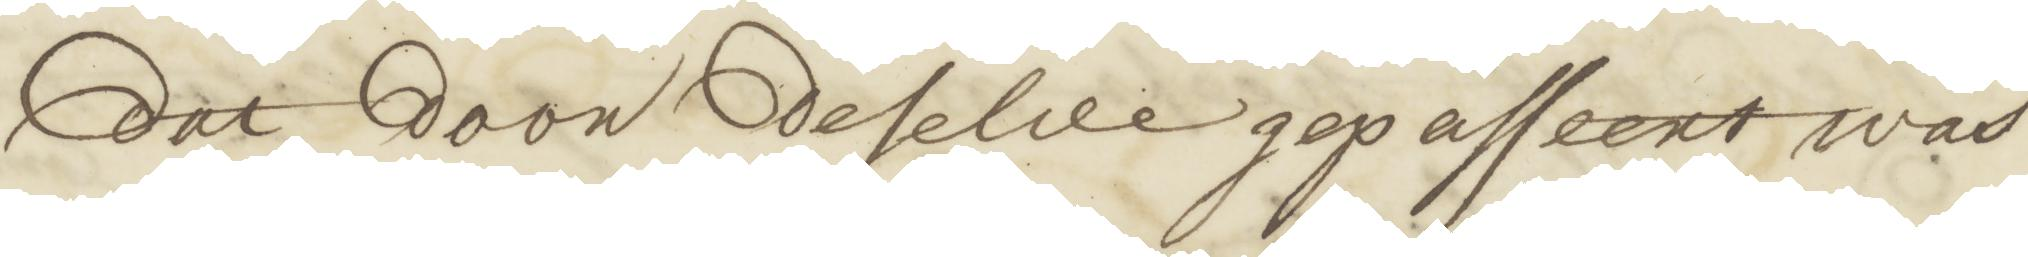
dat door deselve gepasseert was
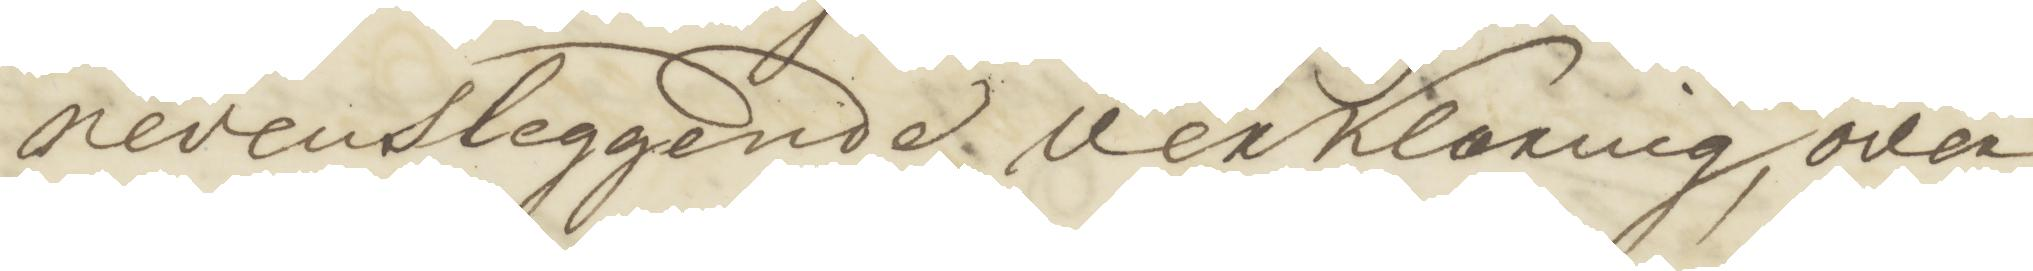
nevensleggende verklaring, over
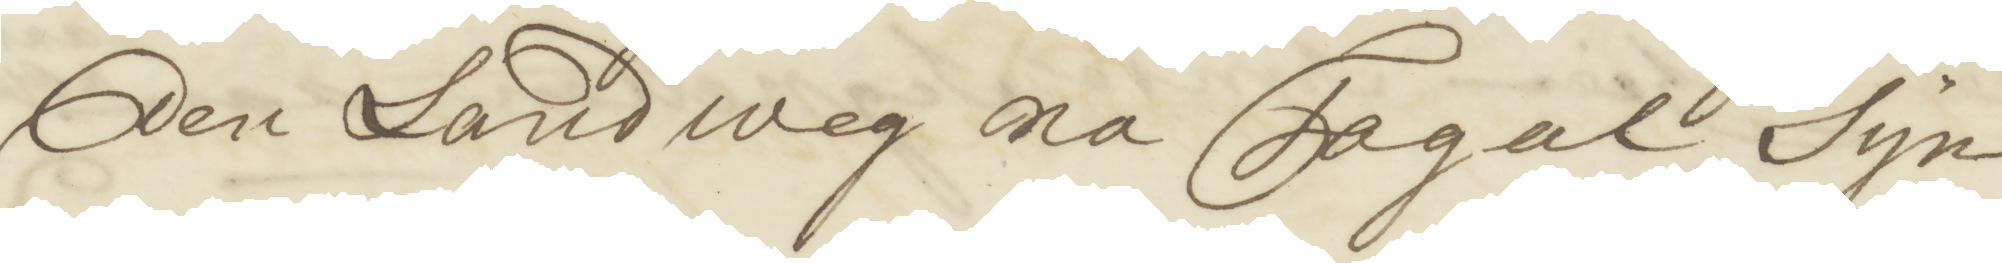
den Land weg na Tagal sijn
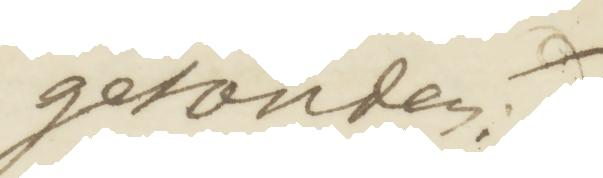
gesonden;
